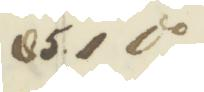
85.1 do
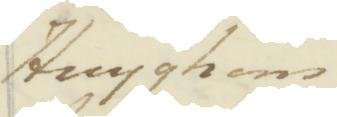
Huyghens
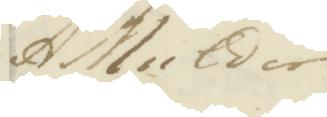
D Mulder
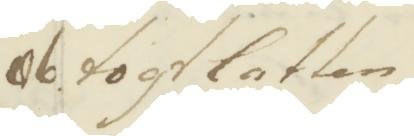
86 togt latten
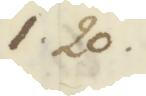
1 20.
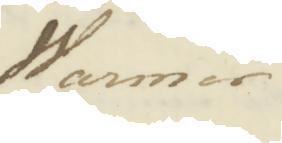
Warner
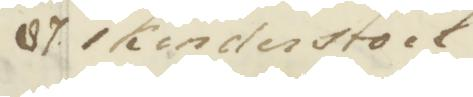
87: 1 kinderstoel
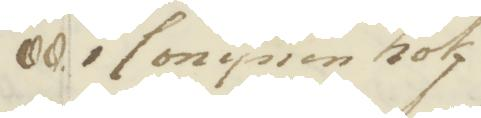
88 1 Conynen hok
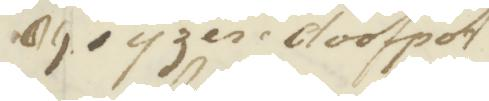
89. yzere doofpot
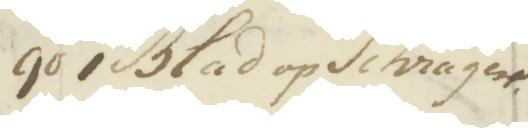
90 1 Blad op schragen
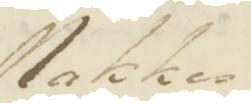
Makker
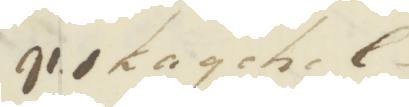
91.1 kagchel
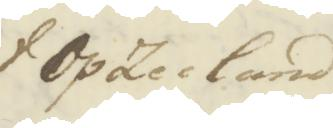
V Op Zeeland
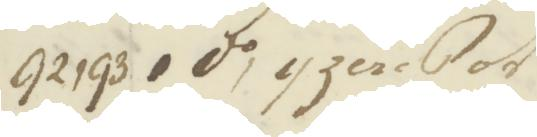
92193:0 d„o yzere Pot
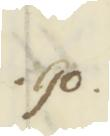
.90
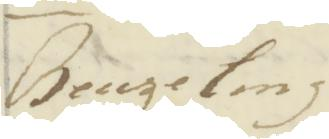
Beuzeling
